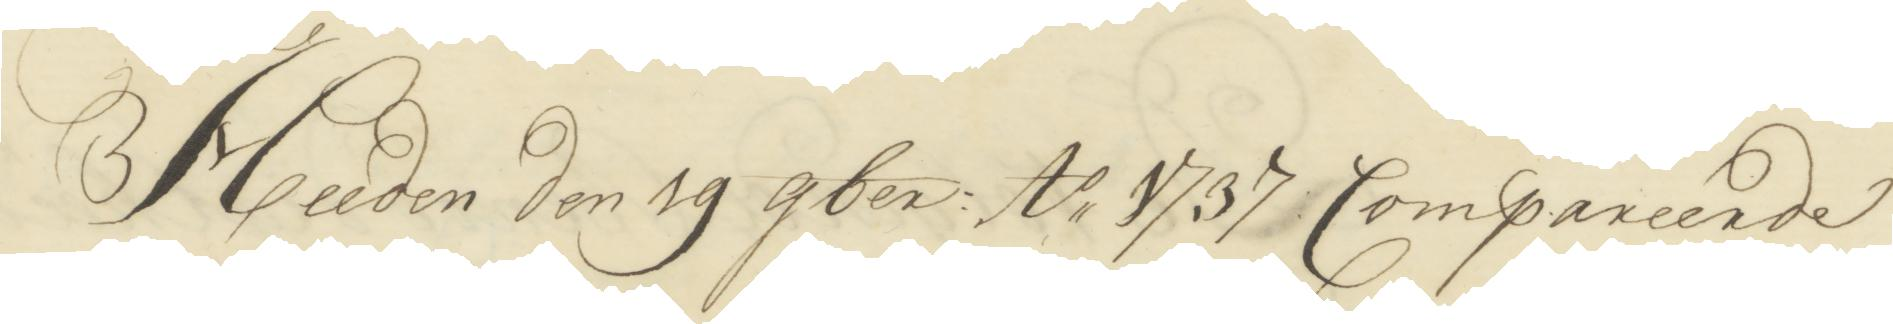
Heeden den 19 gber: A„o 1737: Compareerde
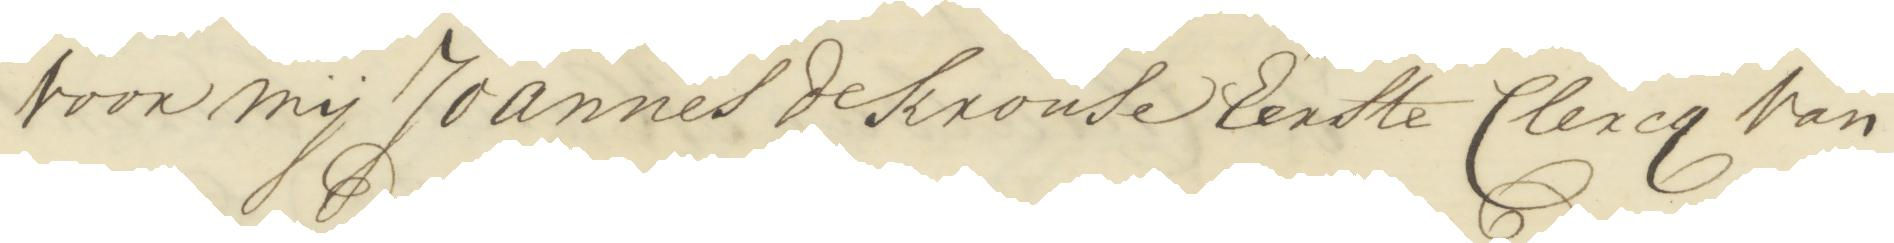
voor mij Joannes dekrouse Eerste Clercq van
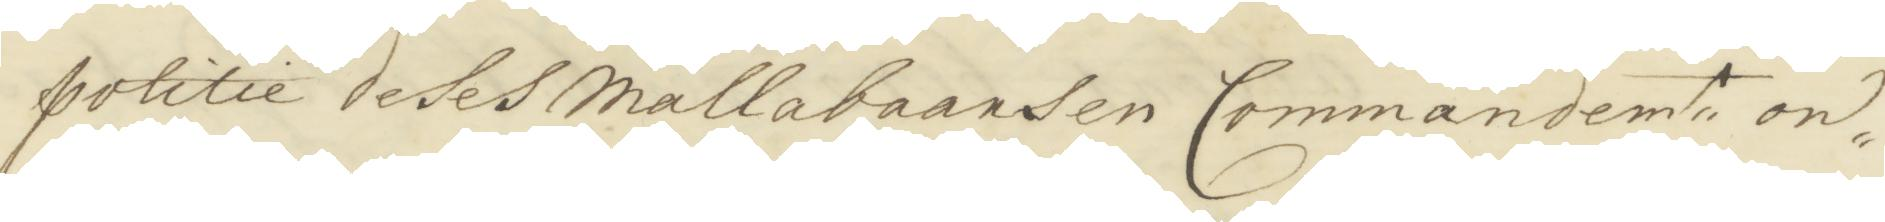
politie deses mallabaarsen Commandem„t on„
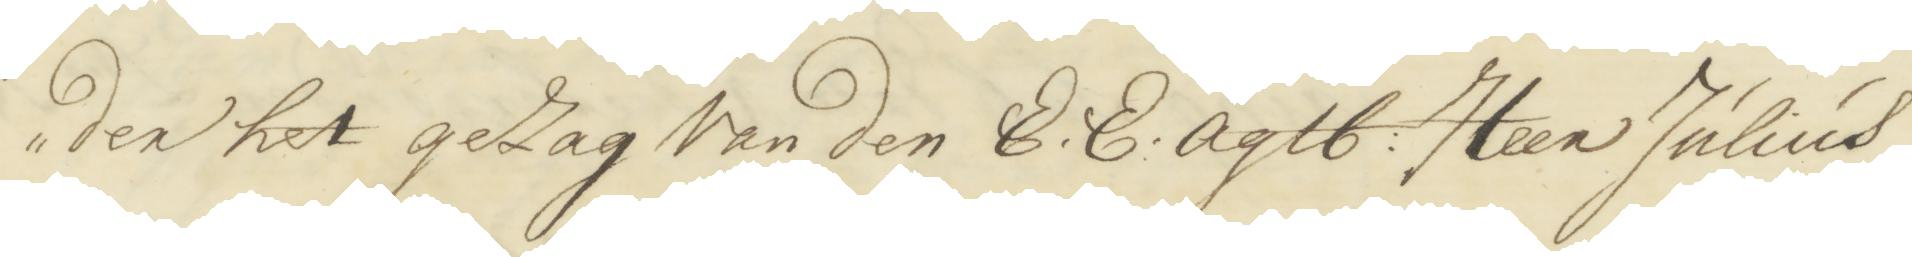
„der het gezag van den E: E: agtb: Heer Julius
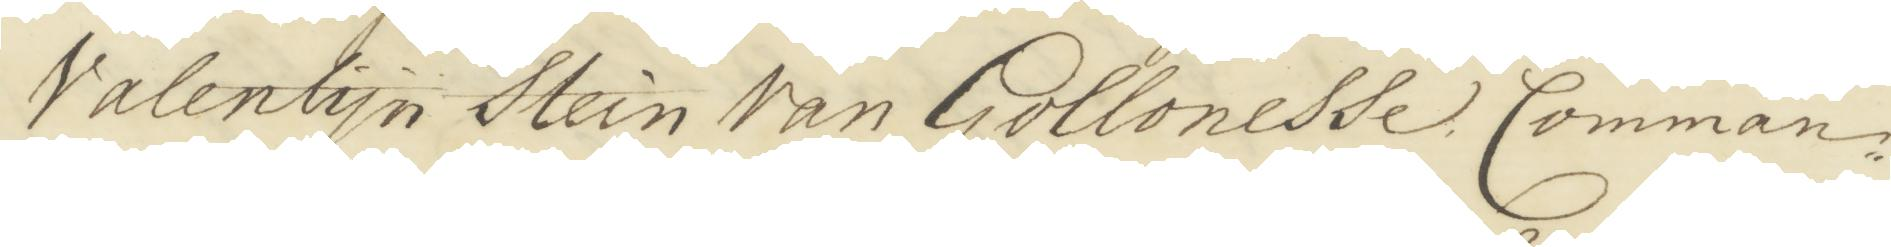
Valenlijn stein van Gollonesse Comman„
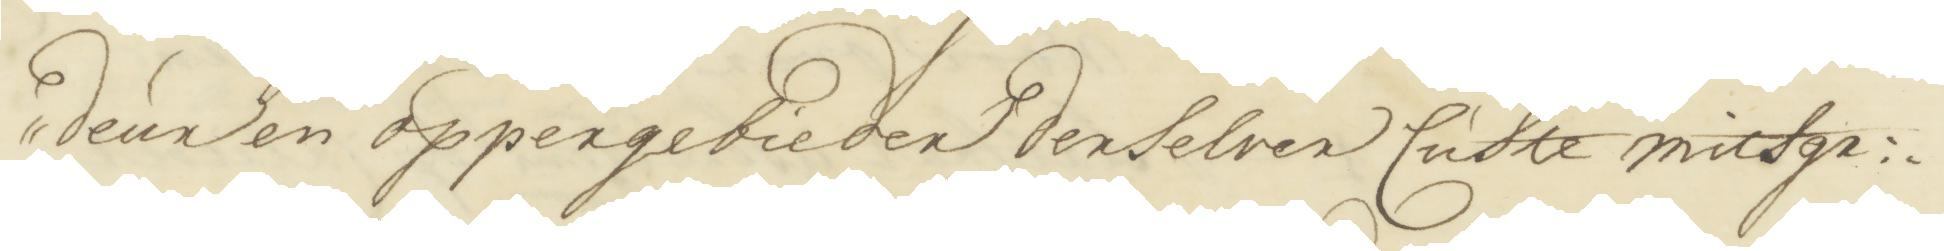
„deur en oppergebieder derselver Custe mitsgr:
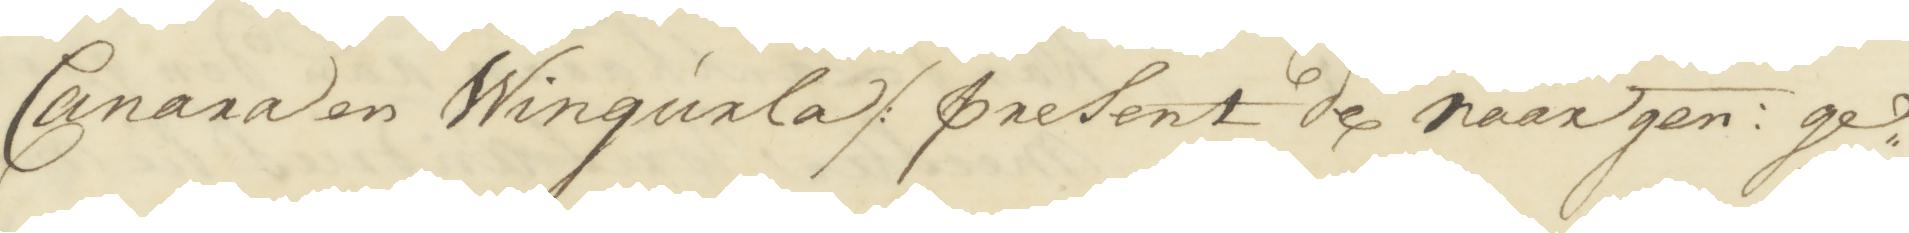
Canara en Wingurla /: present de naar gen: ge„
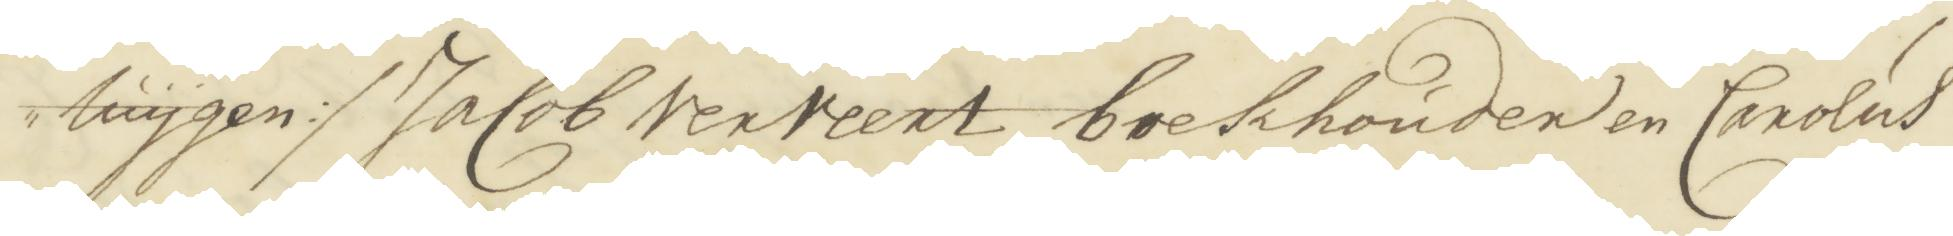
„tuijgen:/ Jacob verveert boekhouder en Carolus
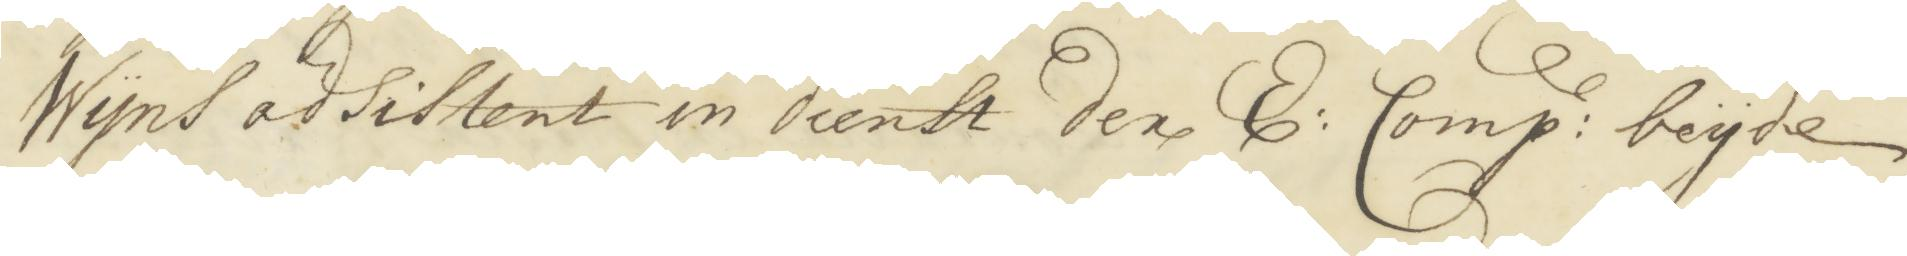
Wijns adsistent in dienst der E: Comp: beijde
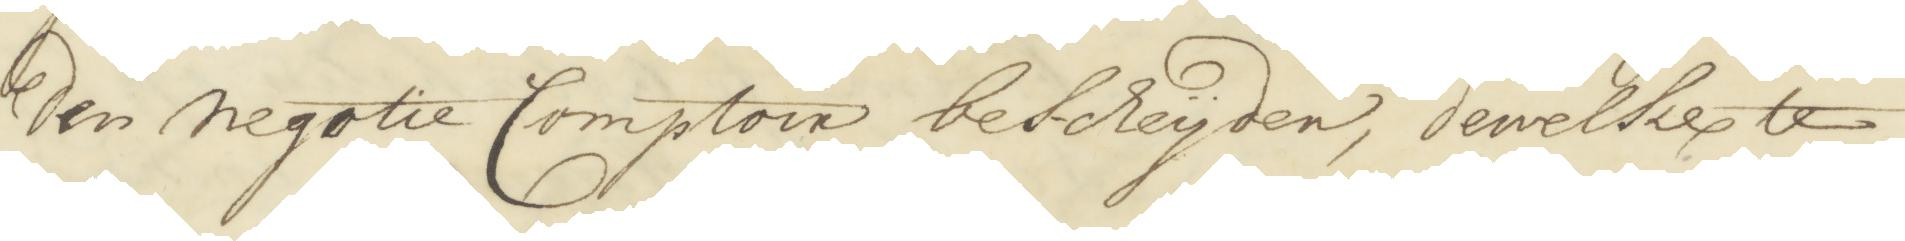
den negotie Comptoir bescheijden, dewelke te
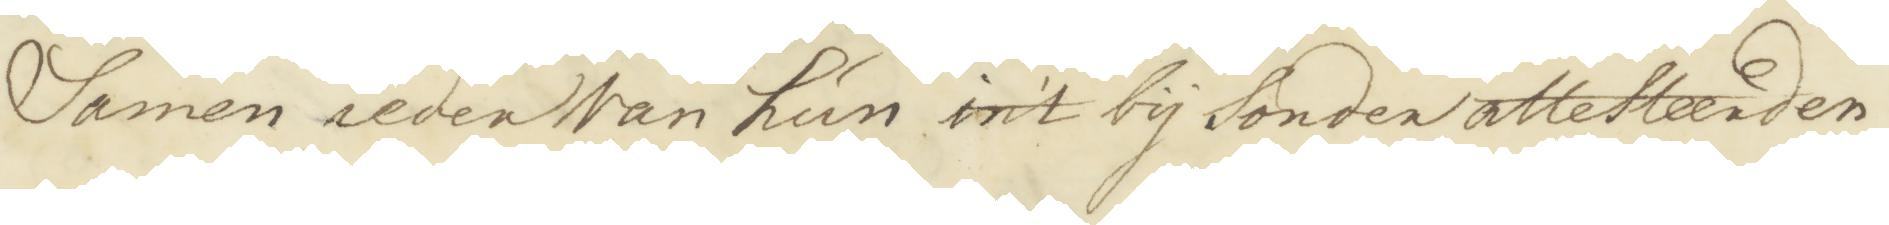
samen ieder van hun in’t bij sonder attesteerden
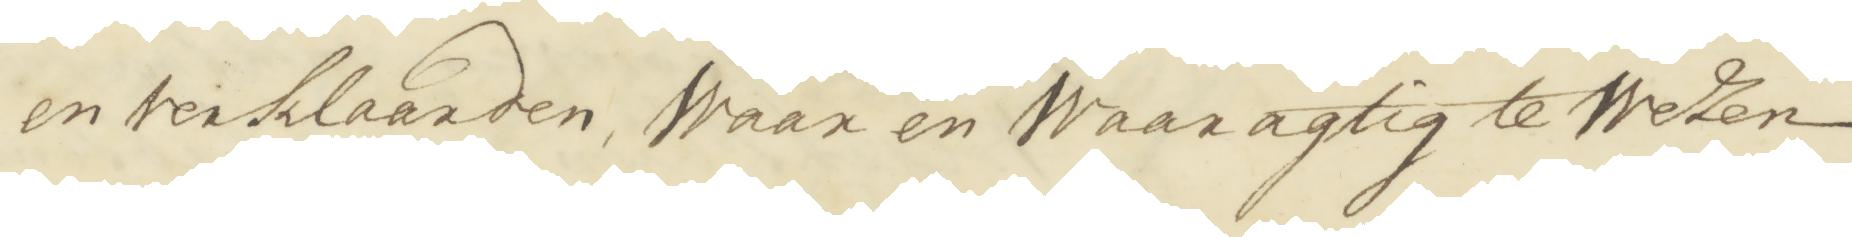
en verklaarden, waar en waaragtig te wezen
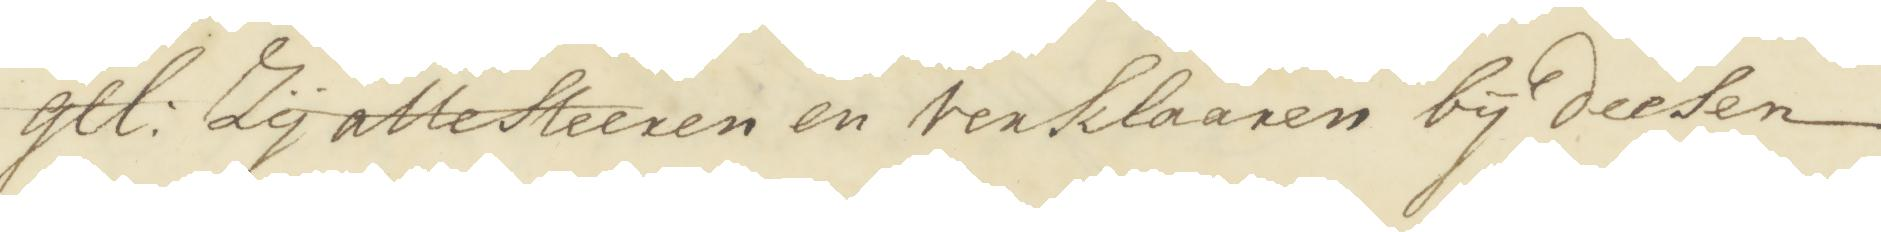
gel: zij attesteeren en verklaaren bij deesen
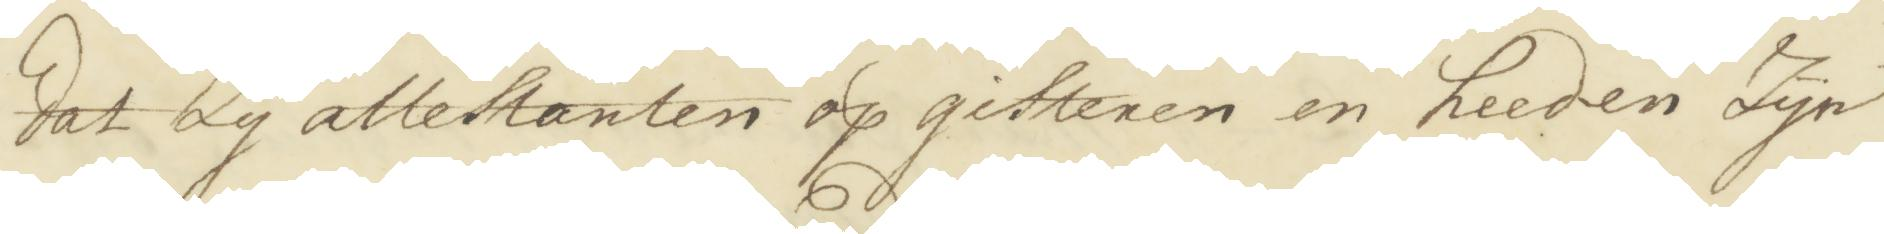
dat zij attestanten op gisteren en heeden zijn
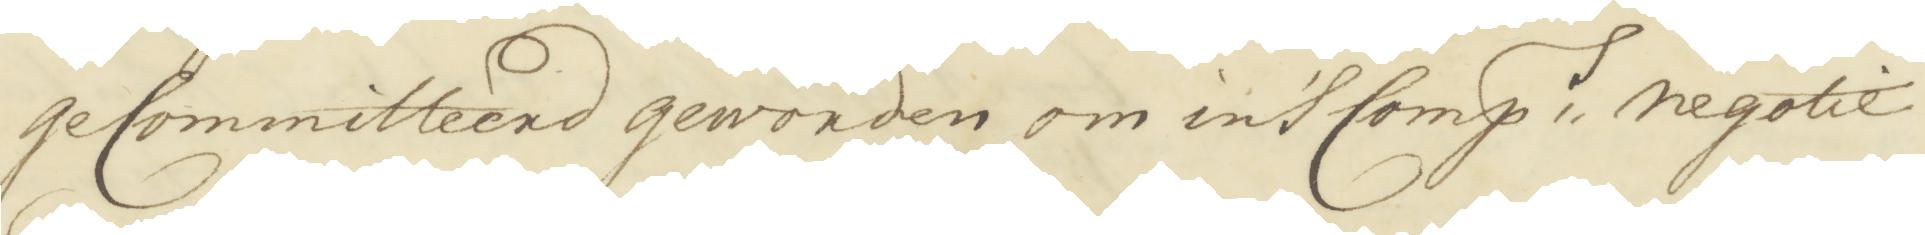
gecommitteerd geworden om in’s Comp„s negotie
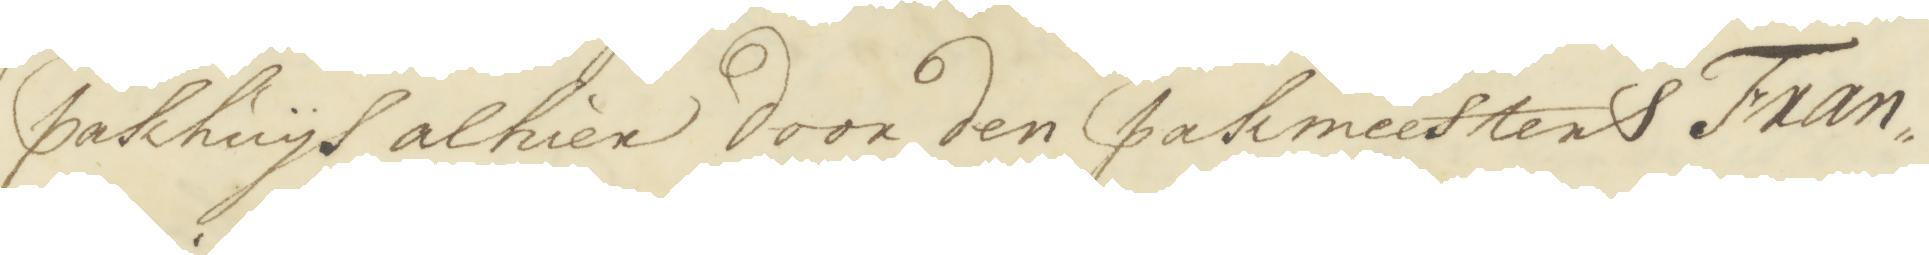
pakhuijs alhier door den pakmeesters Fran„
